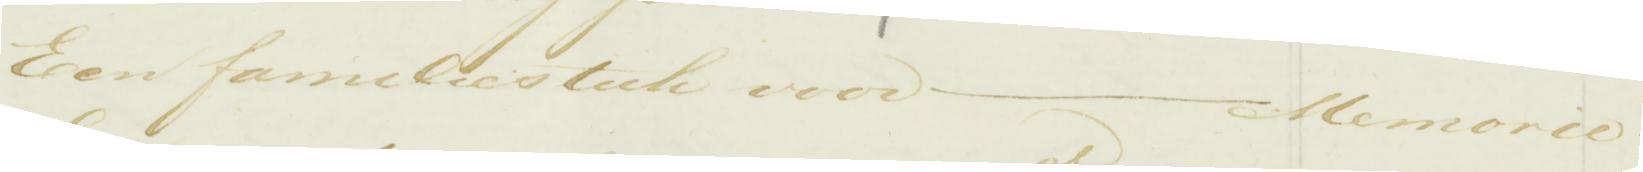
Een familiestuk voor ——— Memorie
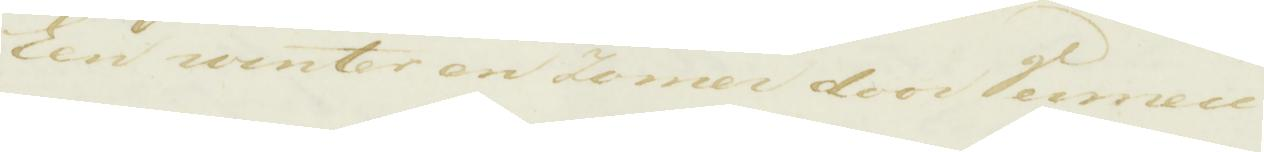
Een winter en zomer door Vermeu
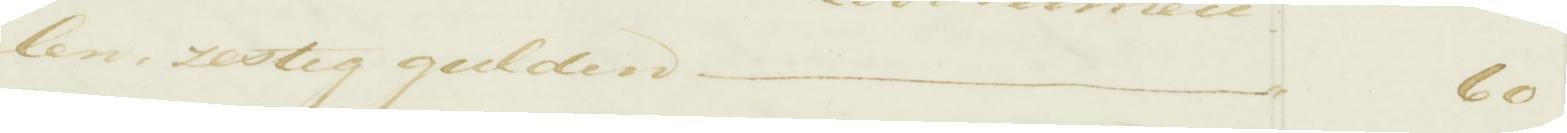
len, zestig gulden ——————— „ 60
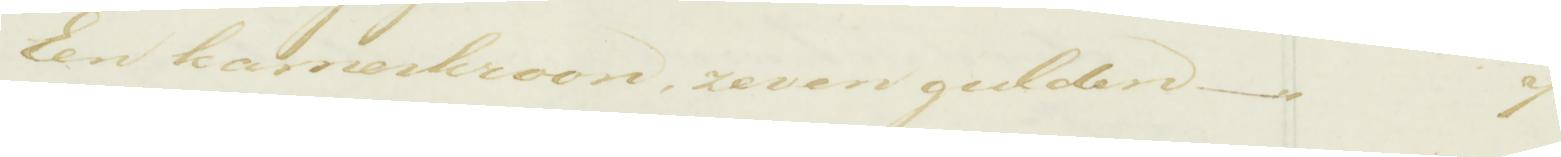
Een kamerkroon, zeven gulden — „ 7
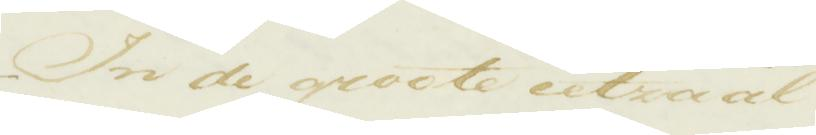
In de groote eetzaal
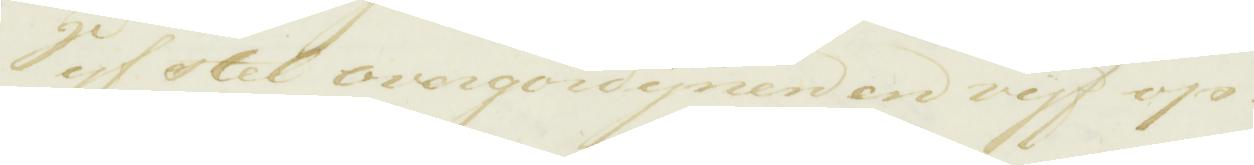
Vyf stel overgordijnen en vijf op
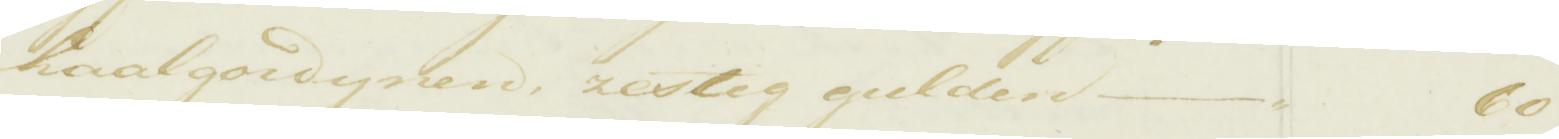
haalgordijnen, zestig gulden —— 60
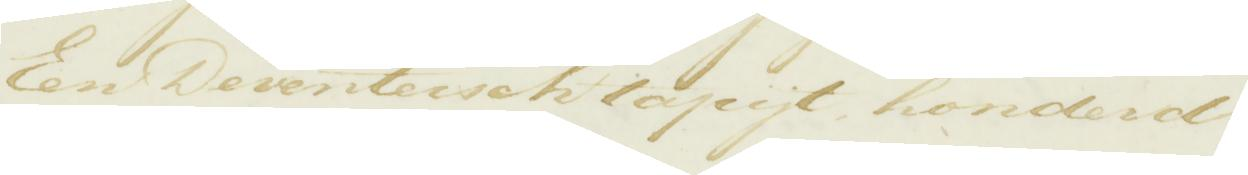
Een Deventersch tapijt, honderd
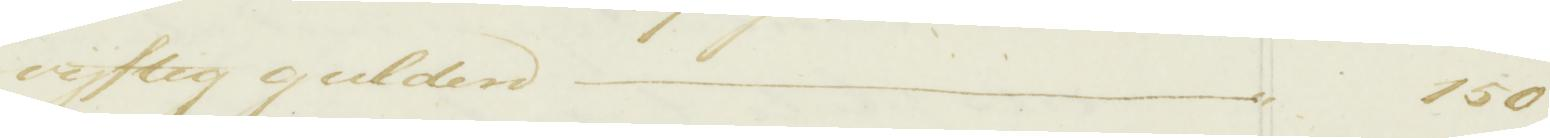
vijftig gulden —————— „ 150
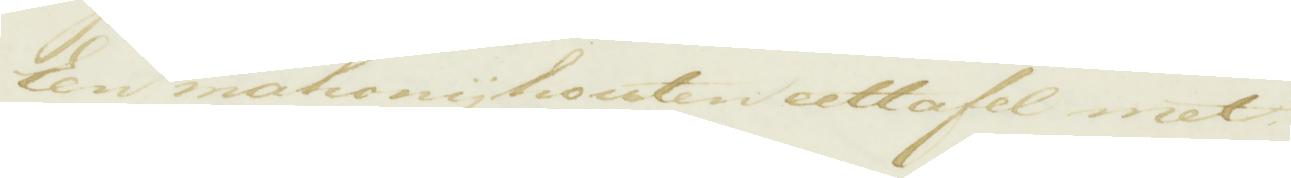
Een mahonijhouten eettafel met
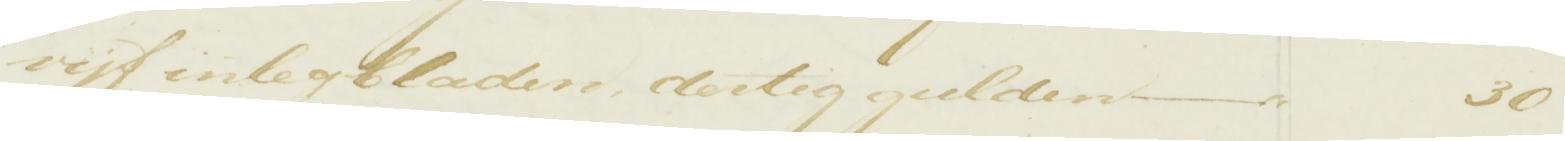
vijf inlegbladen, dertig gulden — „ 30
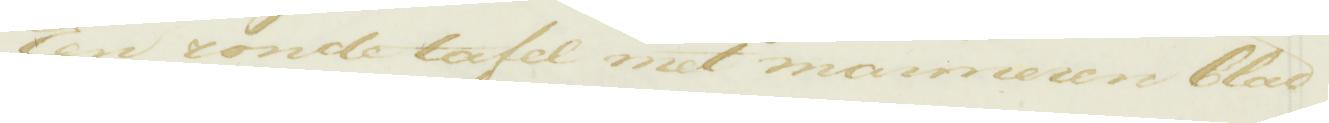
Een ronde tafel met marmeren blad
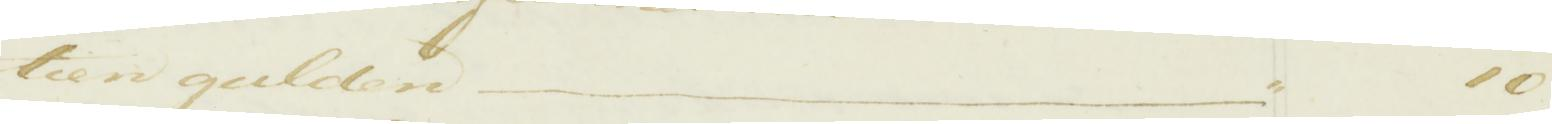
tien gulden————————— „ 10
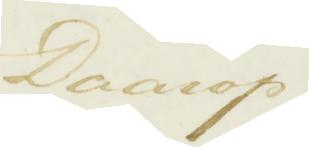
Daarop
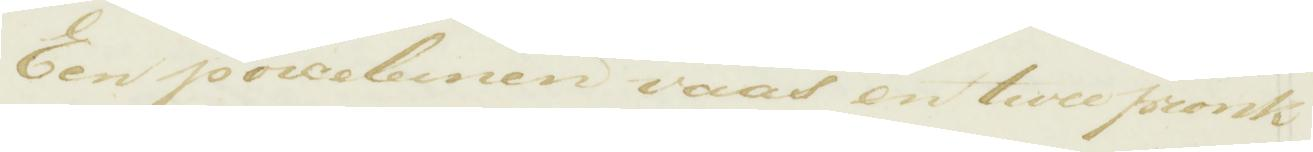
Een porceleinen vaas en twee pronk
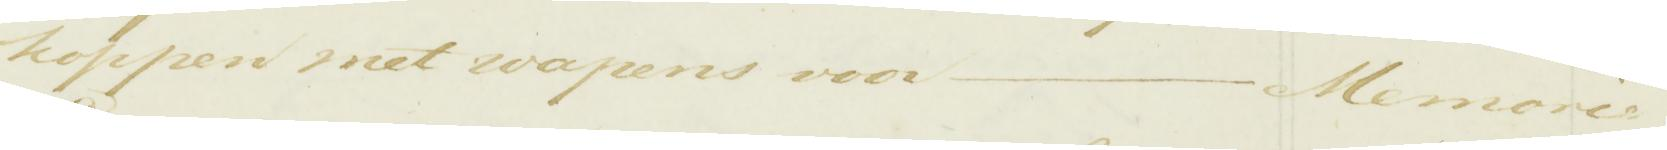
koppen met wapens voor ———Memorie
